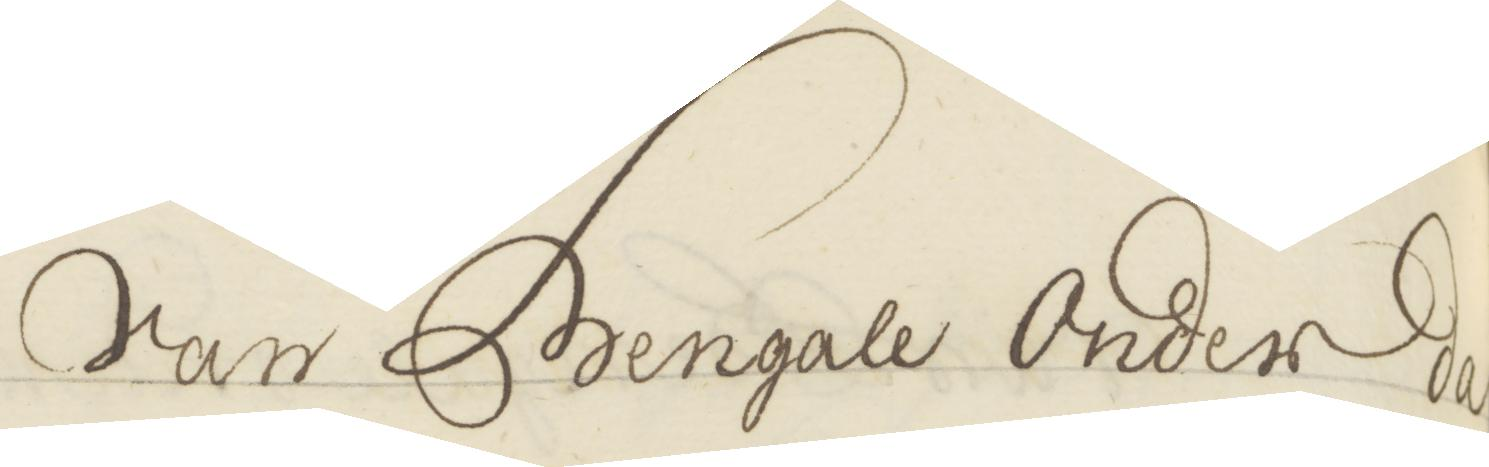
van Bengale Onder dato 3
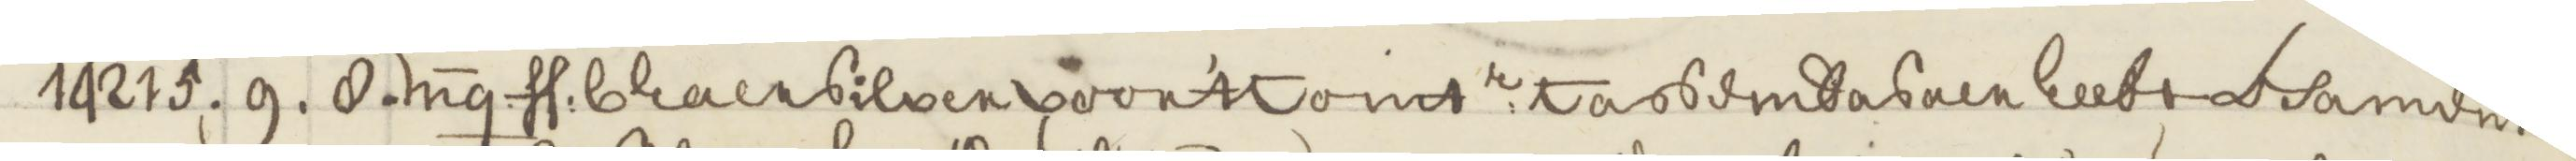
14215. 9. 8. mq: ss: bhaersilver voor’t Comt:r Cassembasaer heeft tesamen met
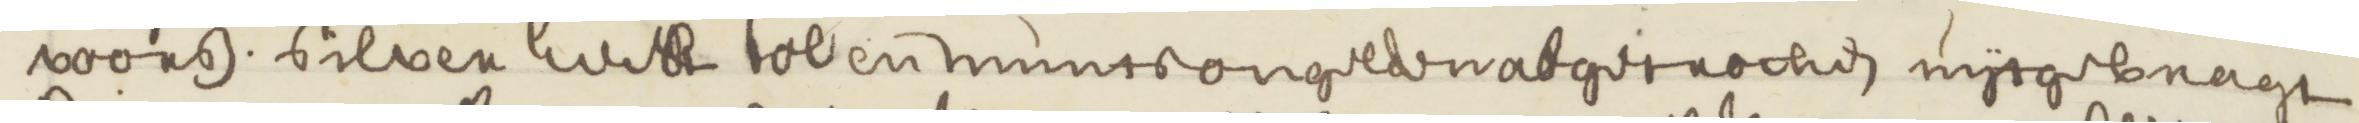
voorz. silver heeft tol en muntsongelden afgetrocken uijtgebragt
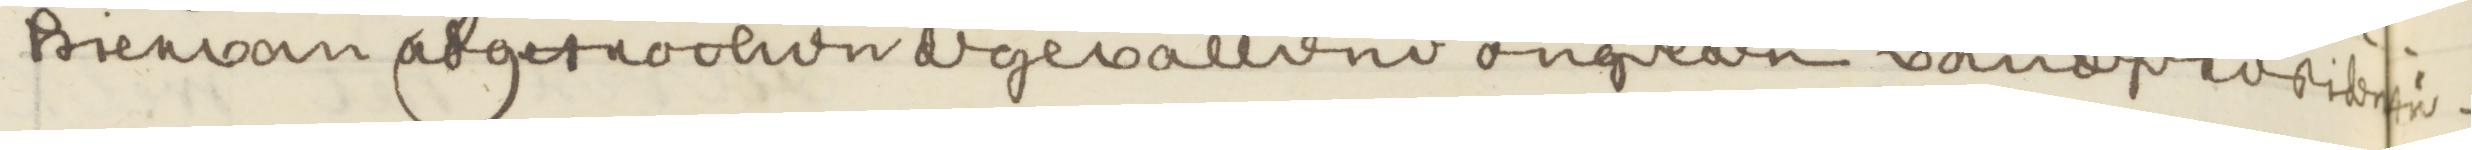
hiervan afgetrocken de gevallene ongelden van dese residentie
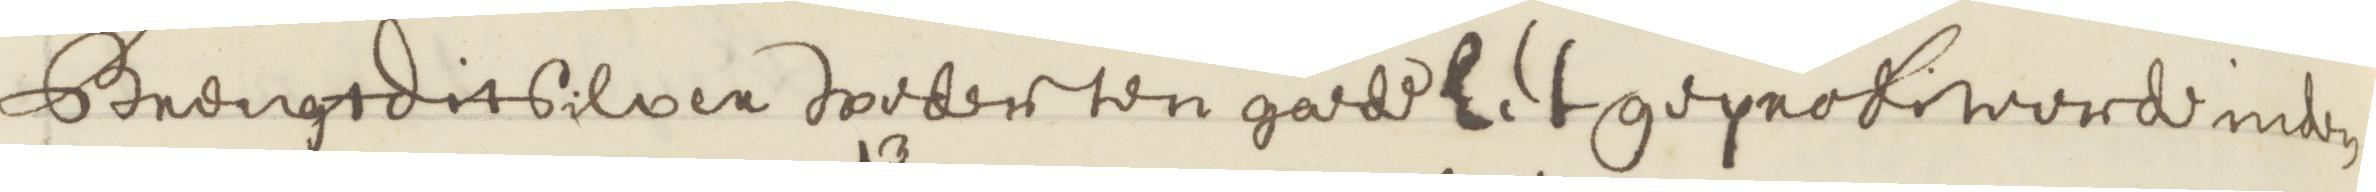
Brengt dit silver weder ten goede het geprofiteerde inden
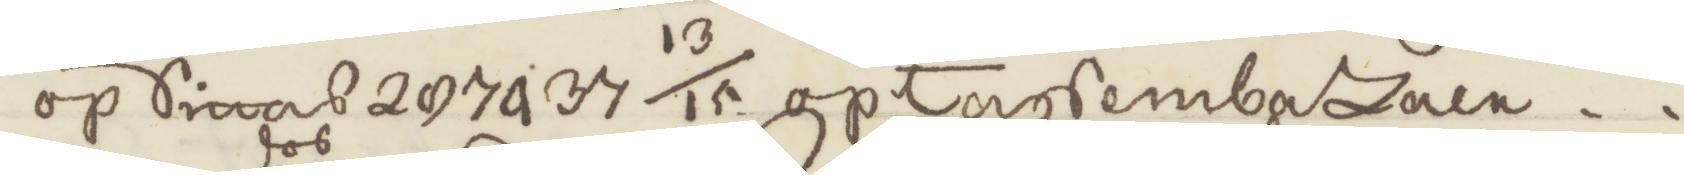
op dimas 2874 37 13/15 op Cassembazaer - -
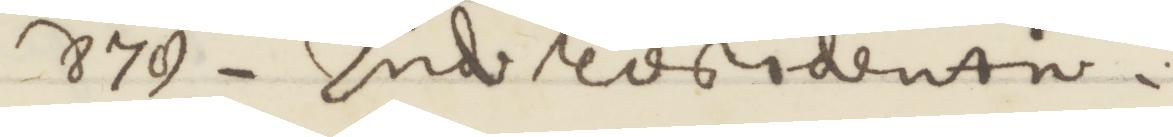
_„os 878 - Inde residentie -
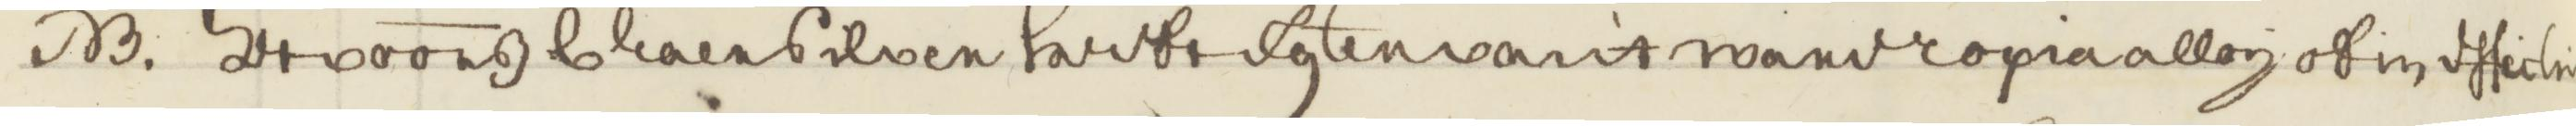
N3. dt voorsz bhaersilver heeft egter van’t ware ropia alloij of in Effectie
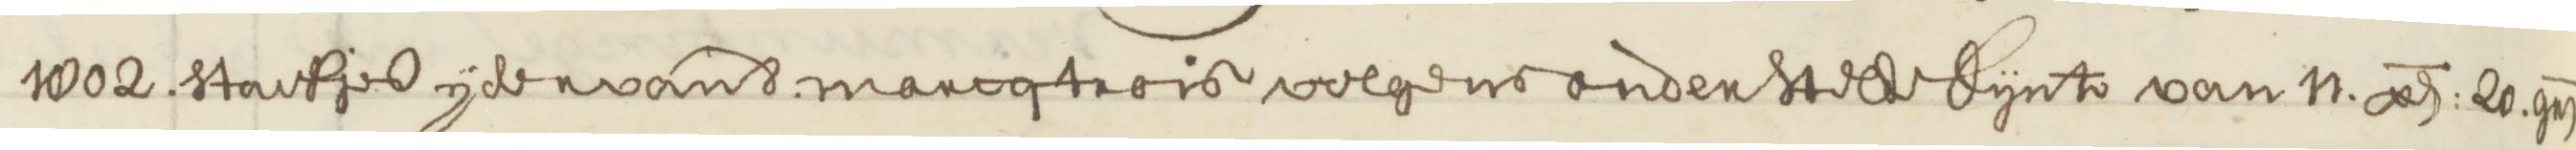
1802. staefjes ijder van 8 marcqtrois volgens onderstelde fijnte van 11. pen: 20. grn:
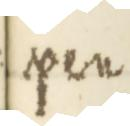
per
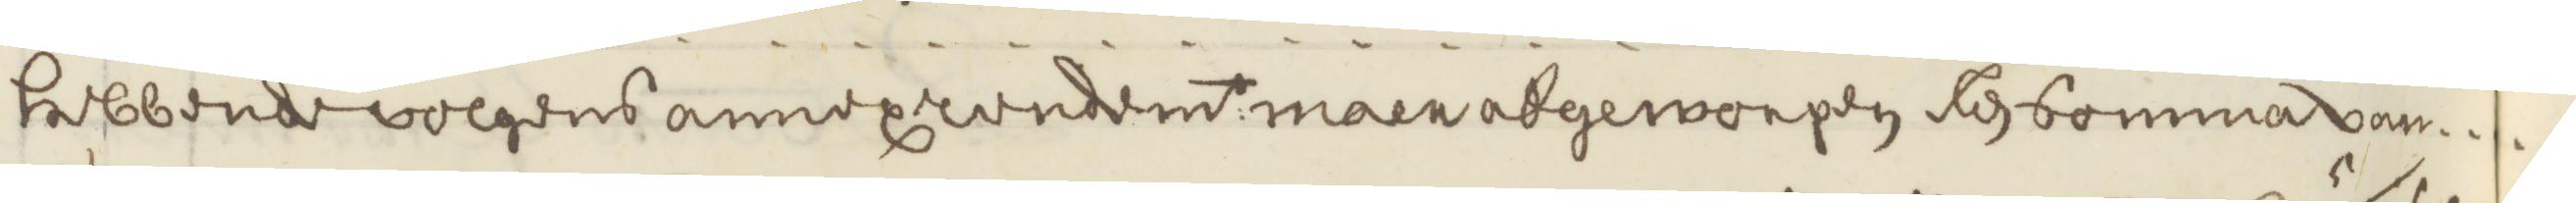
hebbende volgens annex rendem:t maer afgeworpen een somma van . . . .
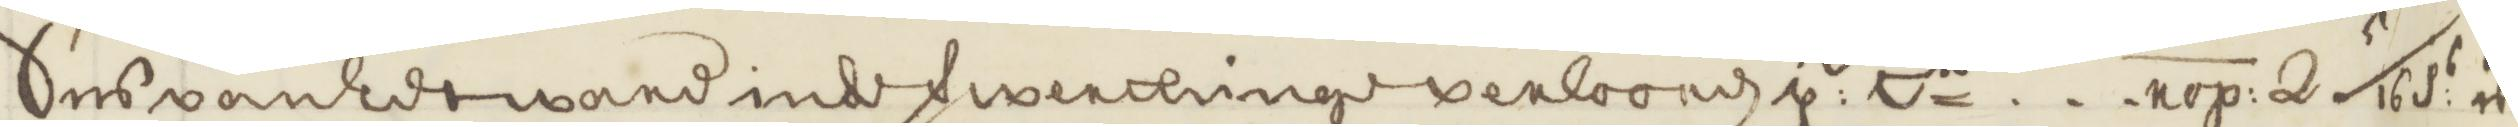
dus van het ware inde verwerckinge verlooren p:r c=to . . . rop: 2 5/16 p:s is
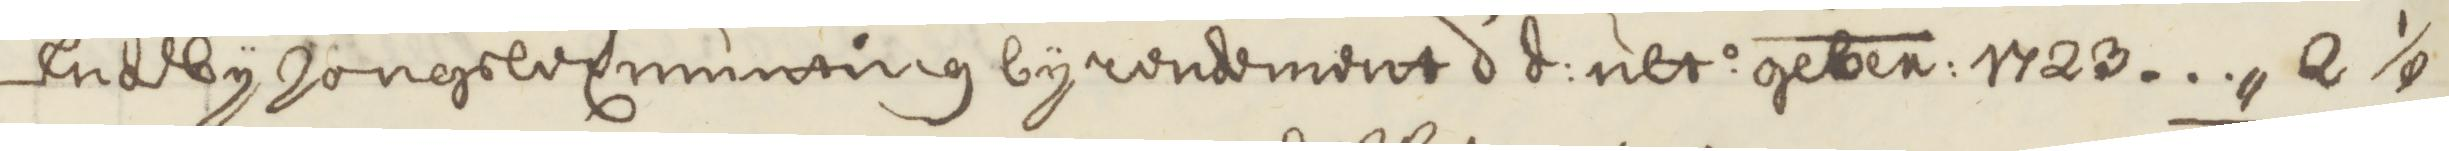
Ende bij jongste vermunting bij rendement d’8: ult:o geber: 1723 . . . „ 2 1/8
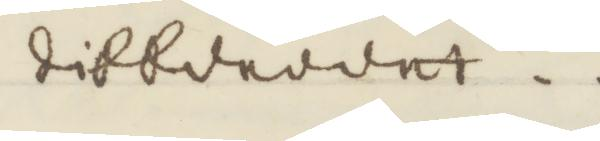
differeert -
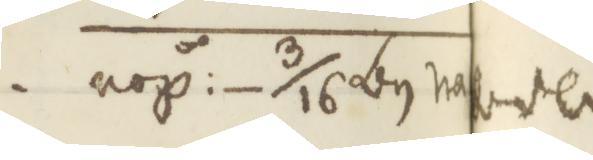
- rop:s – 3/16 ten nadel
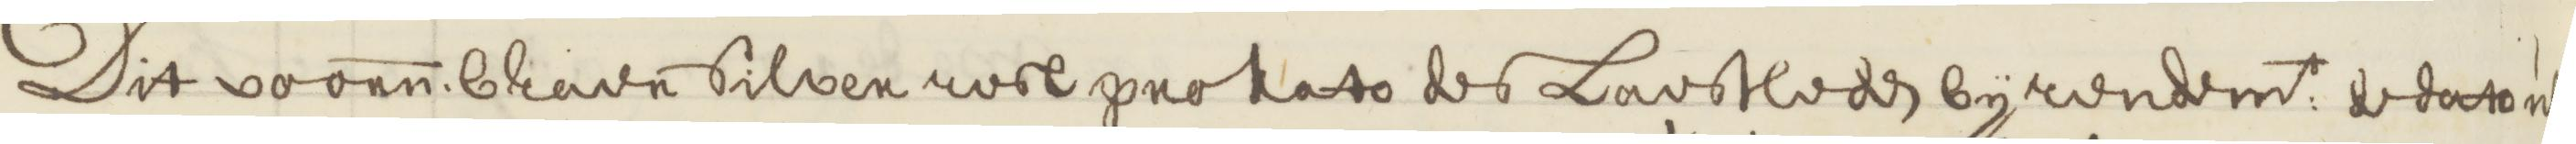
Dit voorn: bhaer silver rest pro rato des Laestleden bij rendem:t de dato ul
